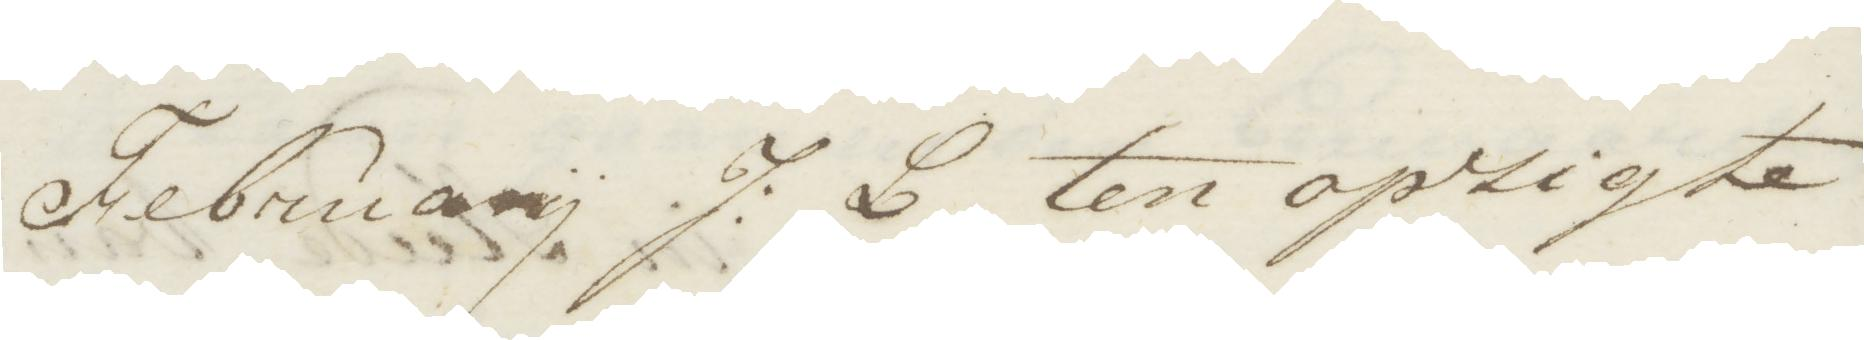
Februarij J: L ten opzigte
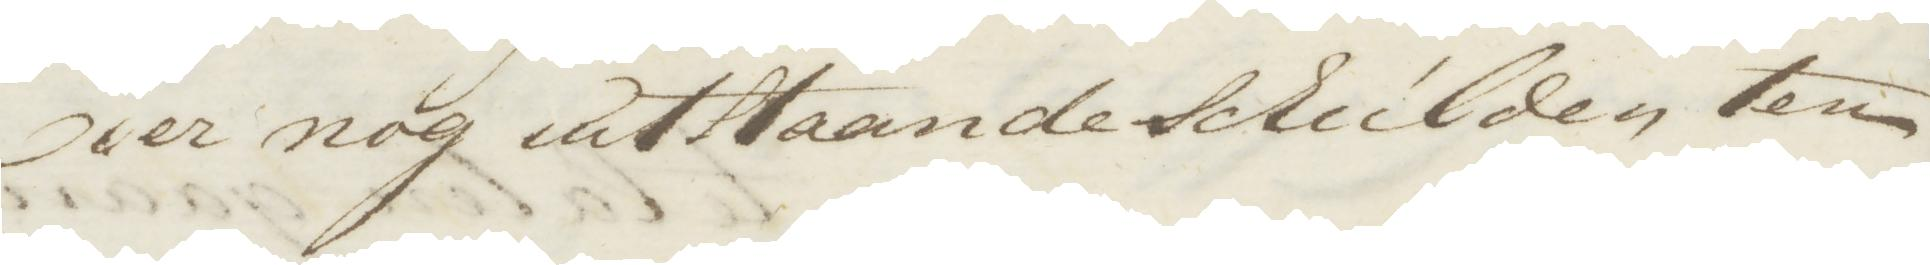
Over nog uitstaande schulden ten
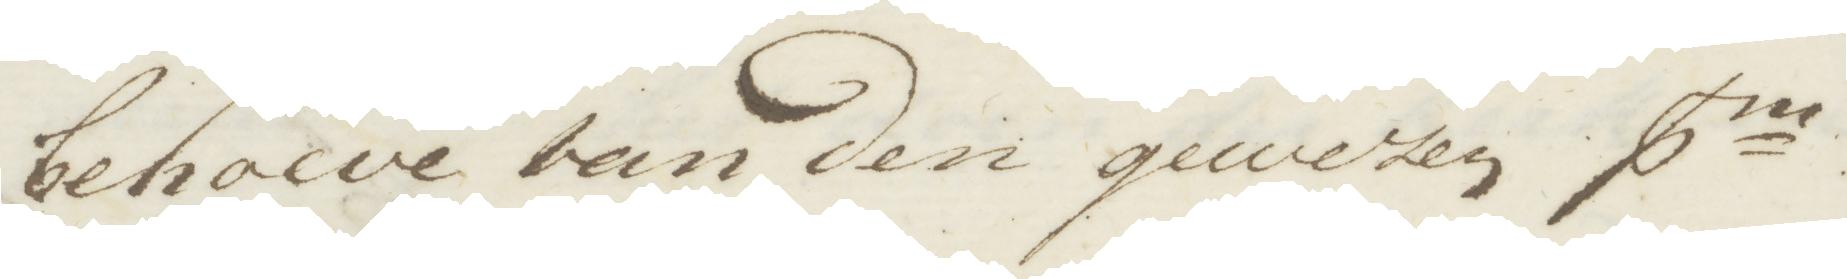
behoeve van den gewezen p=m
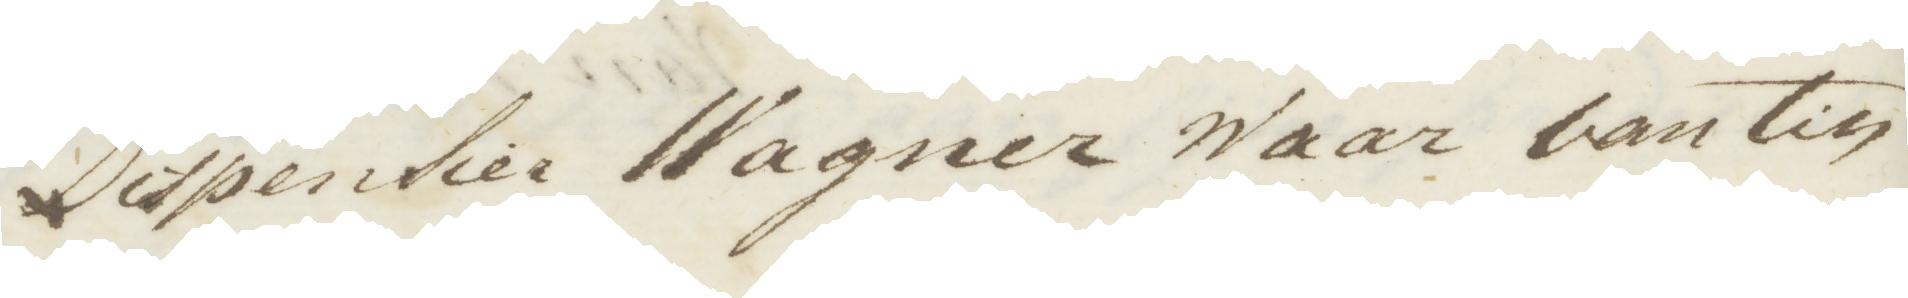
Dispensier Wagner waar van ten
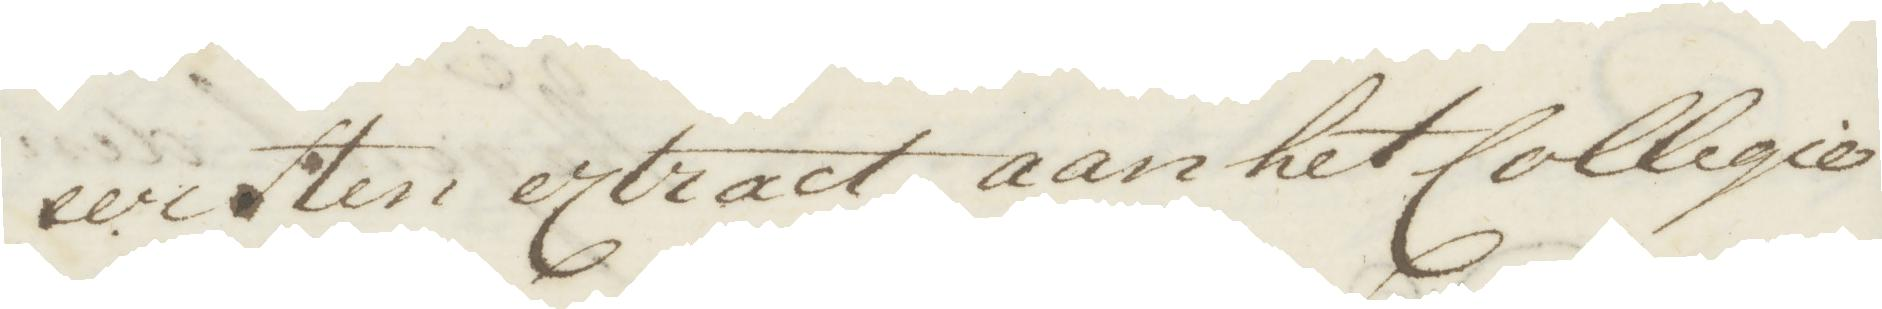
eersten extract, aan het Collegie
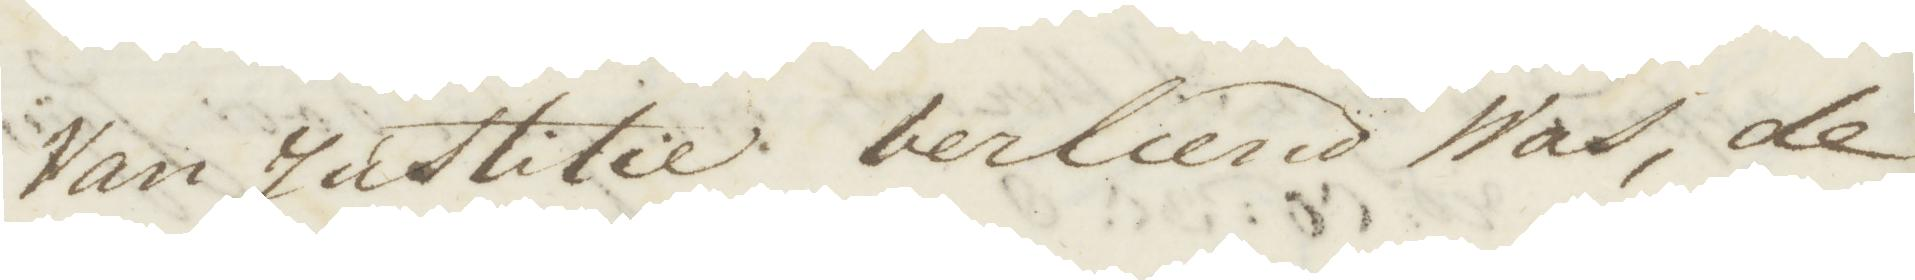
van Justitie verleend was, de
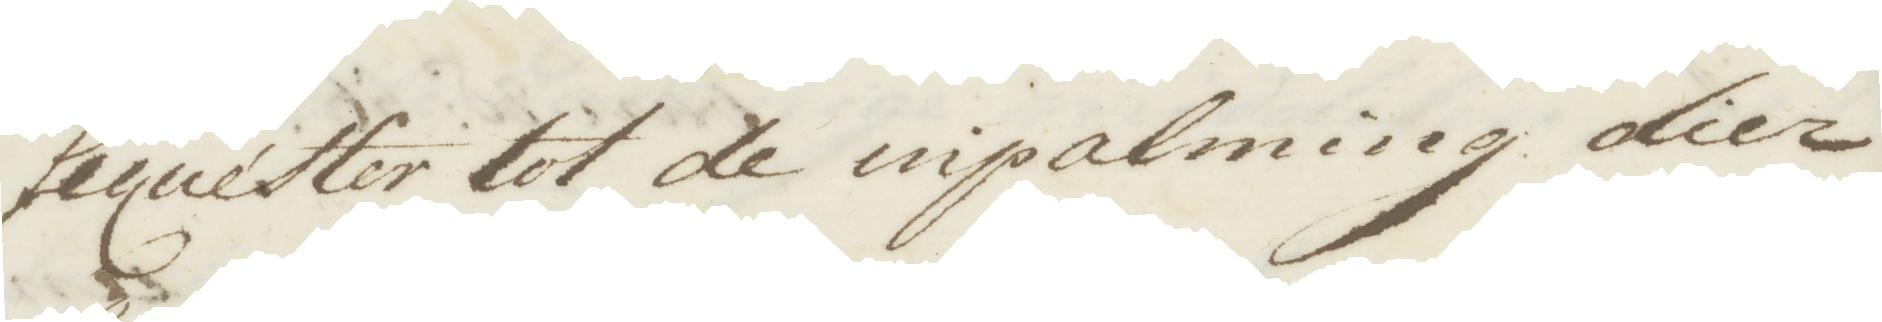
sequester tot de inpalming dier
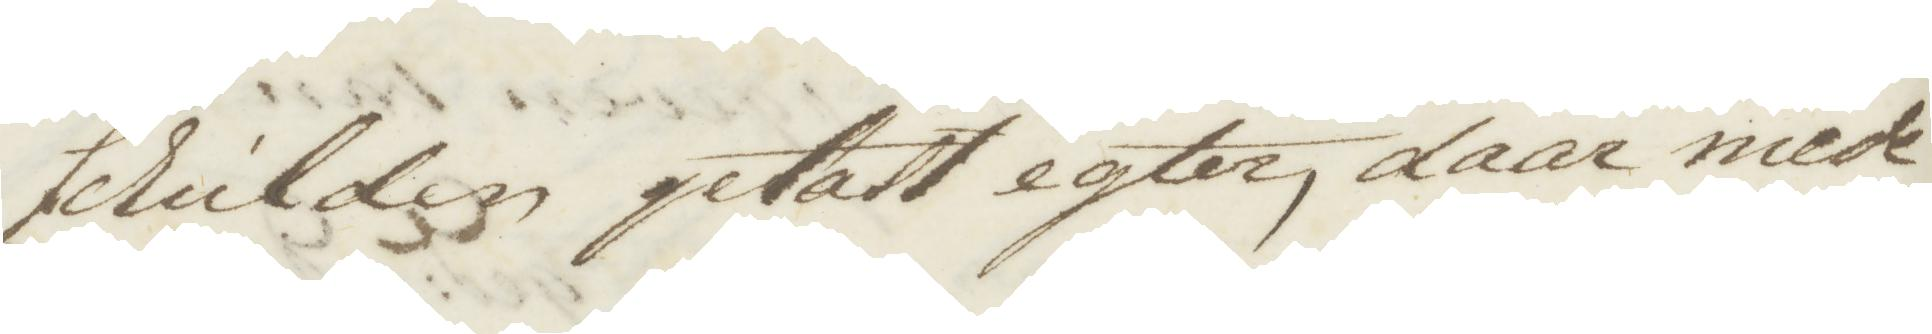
schulden gelast egter, daar mede
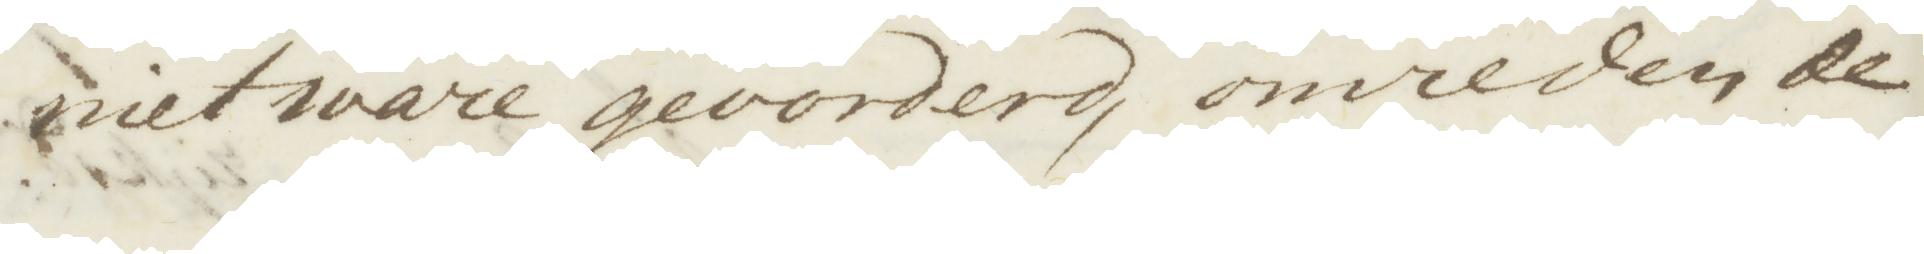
niet ware gevorderd, om reden de
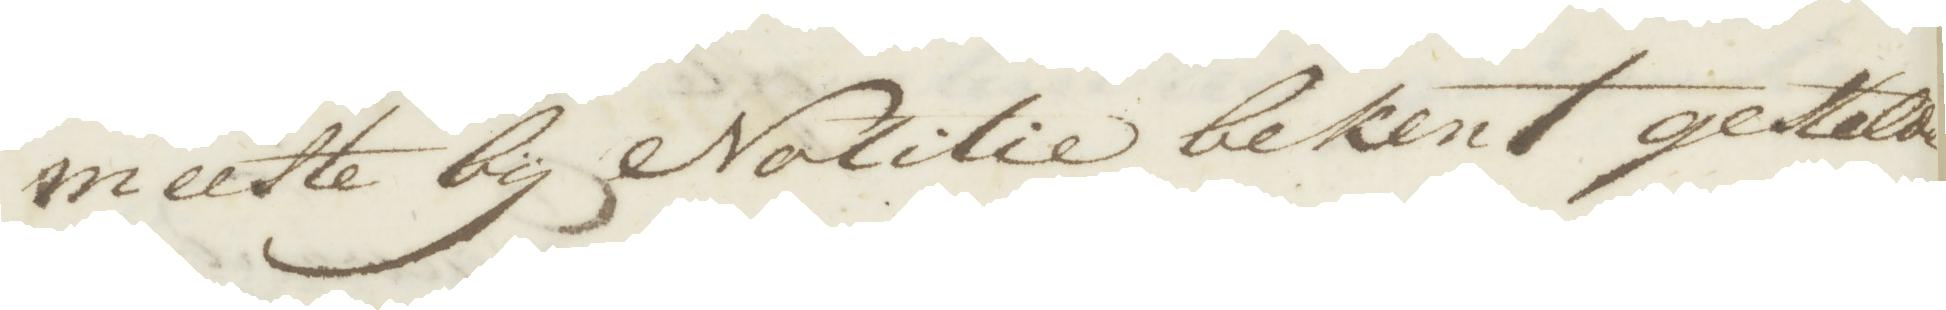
meeste bij Notitie bekent gestelde
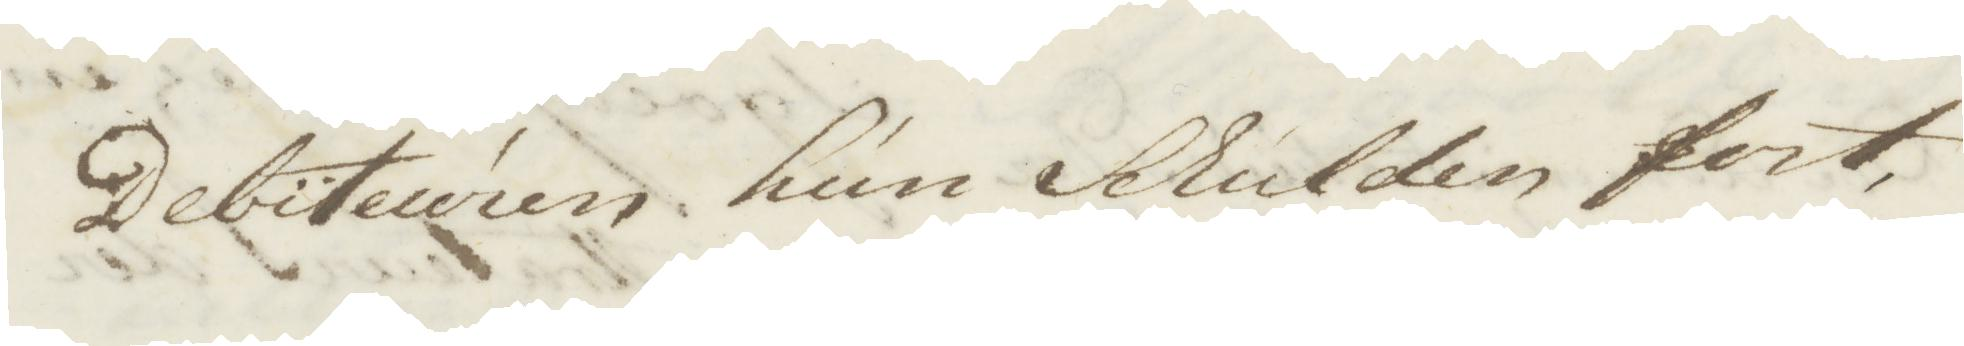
Debiteuren hun schulden fort,
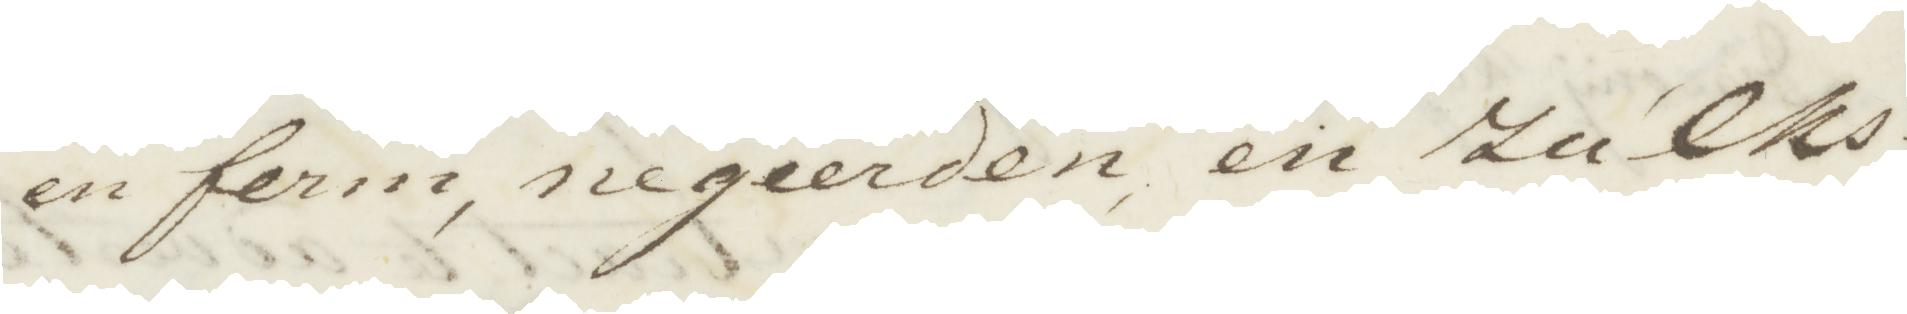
en ferm, negeerden, en zulks
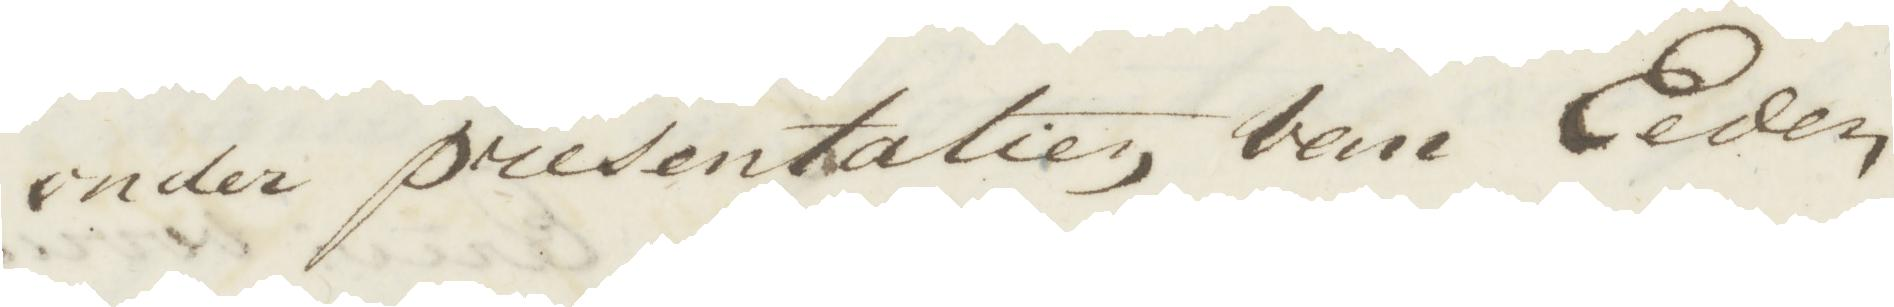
onder presentatien van Eeden
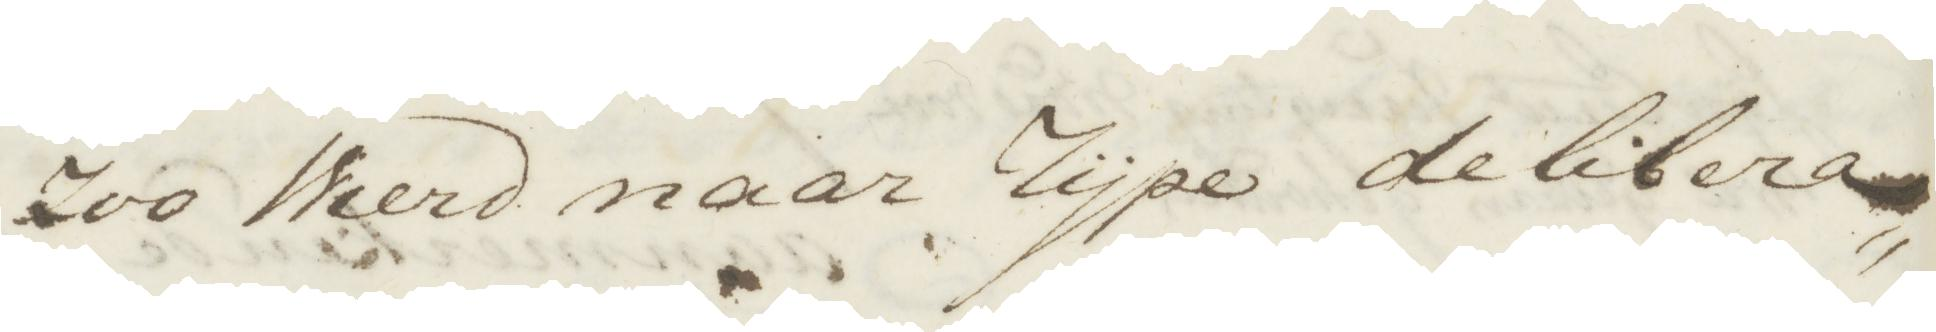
zoo wierd naar rijpe delibera„
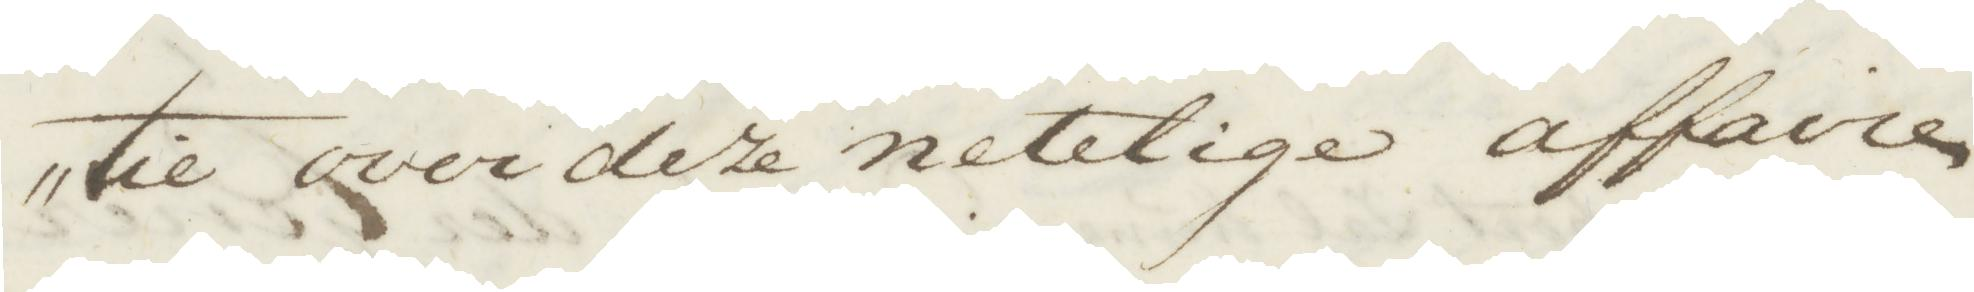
„tie over deze netelige affairen
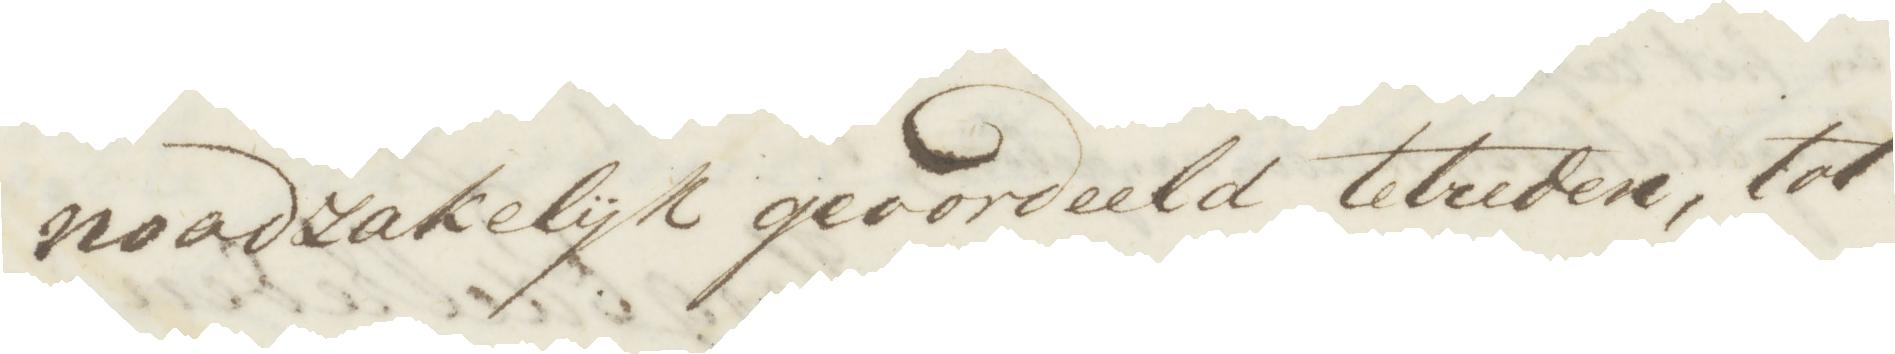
naadzakelijk geoordeeld tetreden, tot
